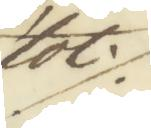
tot:
